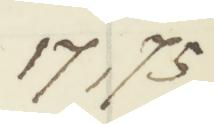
17,75
